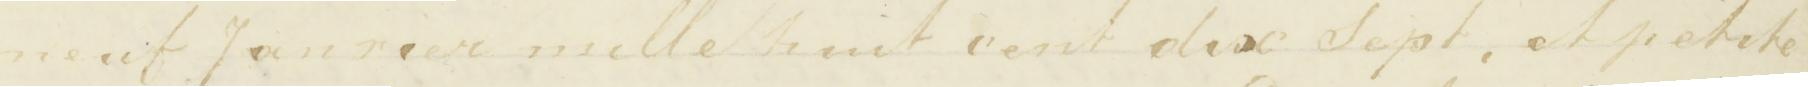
neuf Janvier mille huit cent dix sept, et petite
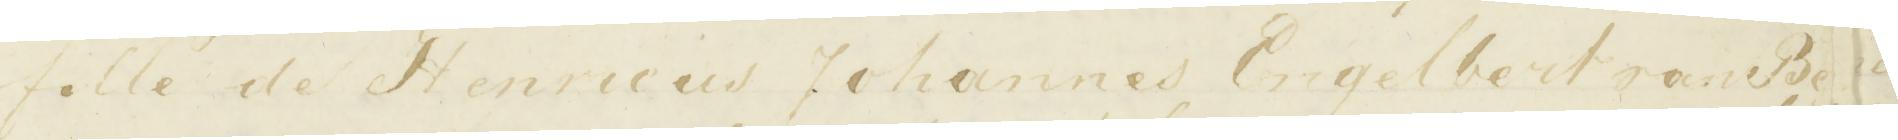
fille de Henicus Johannes Engelbert van Be
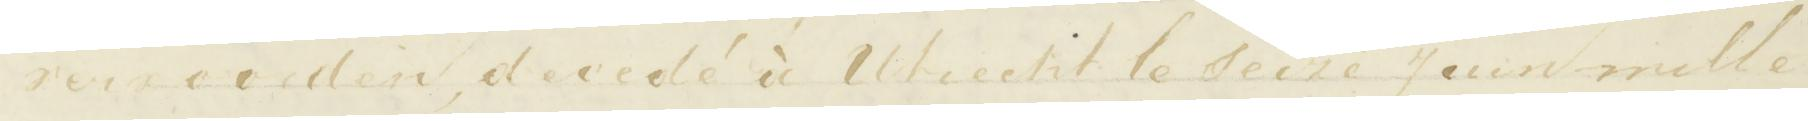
vervoorden, decedé à Utrecht le seize Juin mille
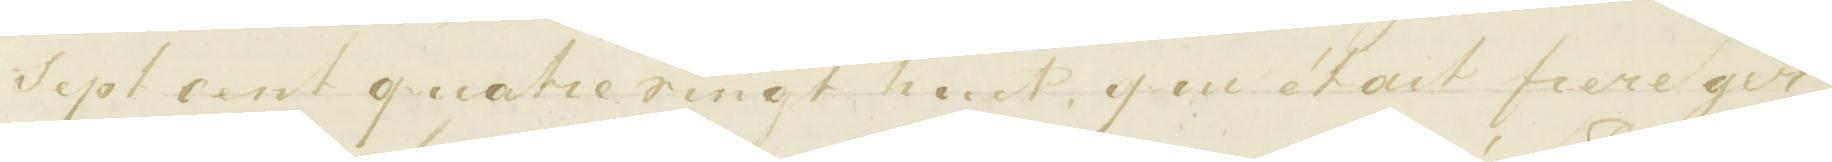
sept cent quatre vingt huit, qui était frere ger
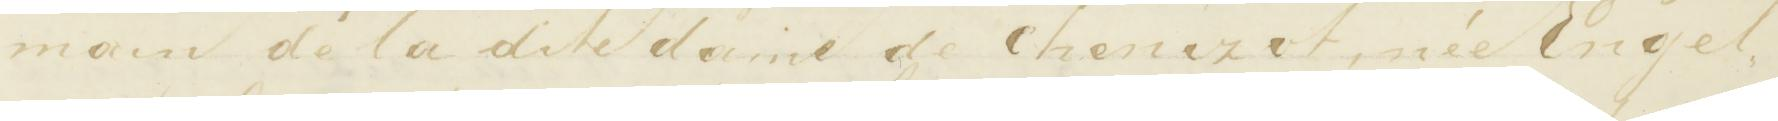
main de la dite dame de Chenizot, née Engel„
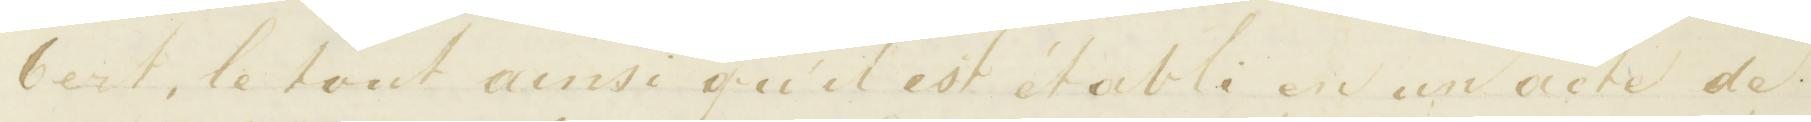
bert, le tout ainsi qu'il est établi en un acte de
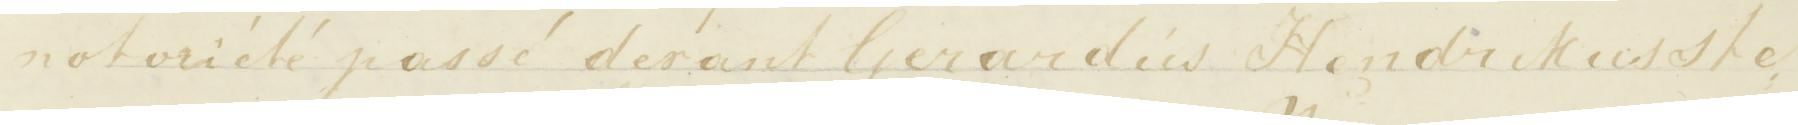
notoriété passé devant Gerardus Hendrikus Ste„
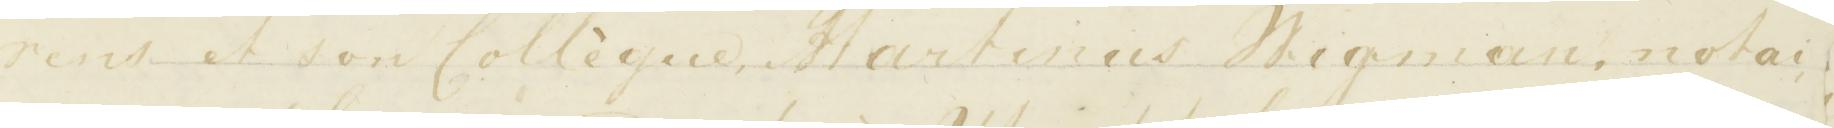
vens et son Collègue, Martinus Nignian, notai„
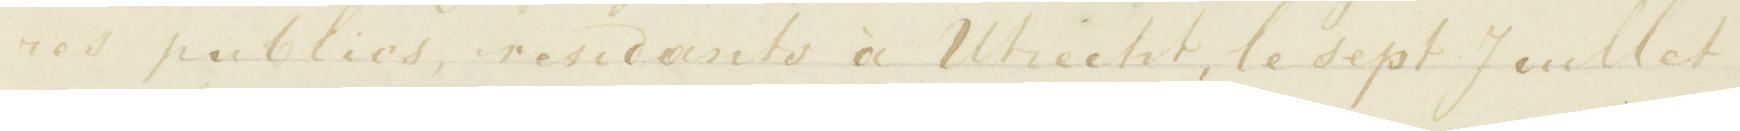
res publics, residants à Utrecht, le sept Juillet
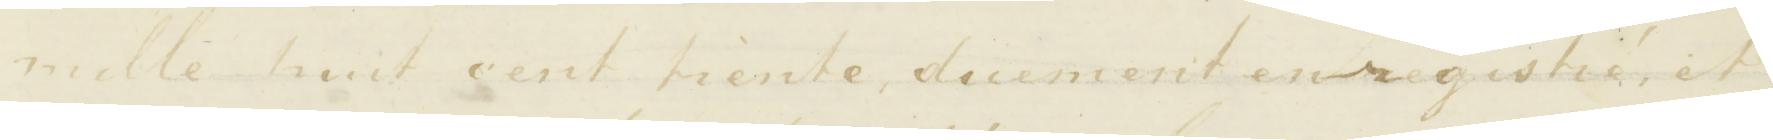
mille huit cent trente, dicement enregistré, et
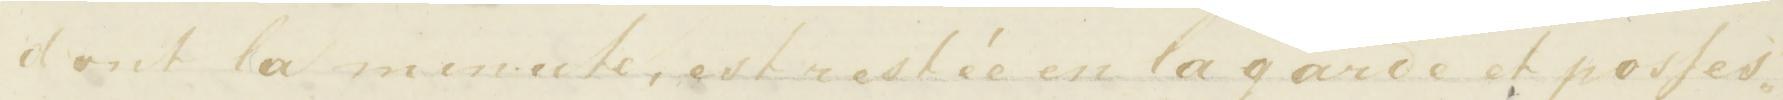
dont la minute, est restée en la garde et posses„
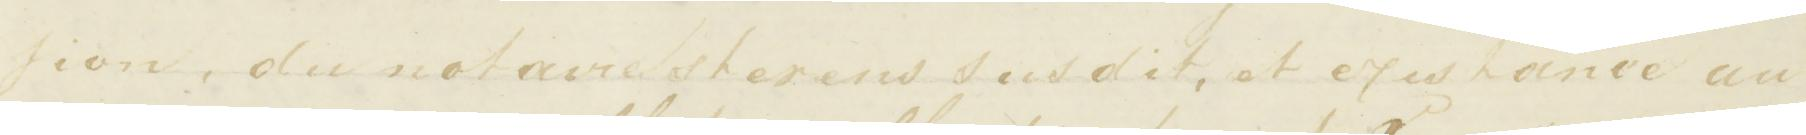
sion, du notaire Stevens susdit, et existance au
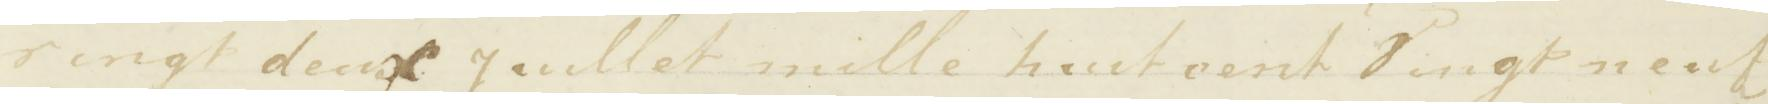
vingt deux Juillet mille huit cent Vingt neuf
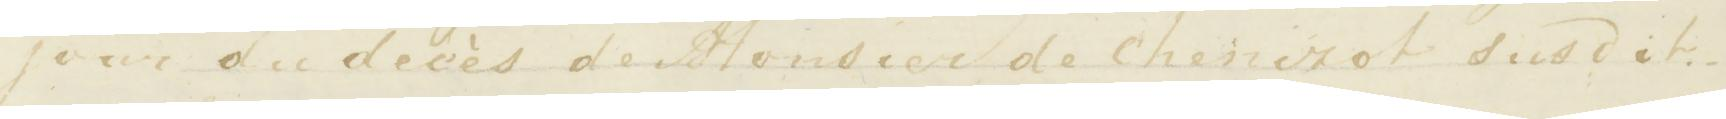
jour du decès de Monsier de Chenizot susdit
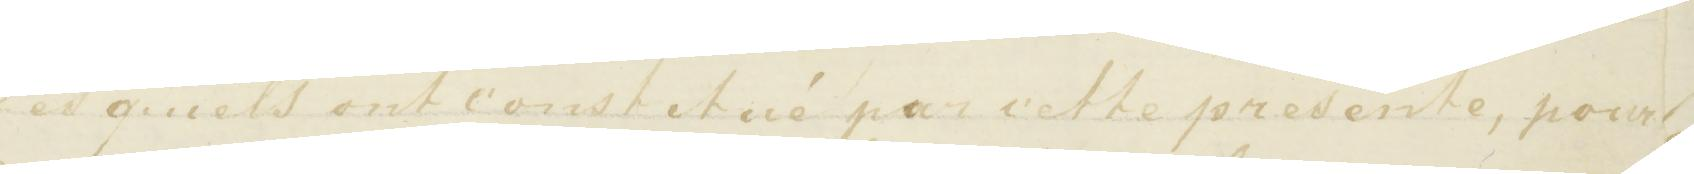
Ses qui els ont constitué par cette presente, pour
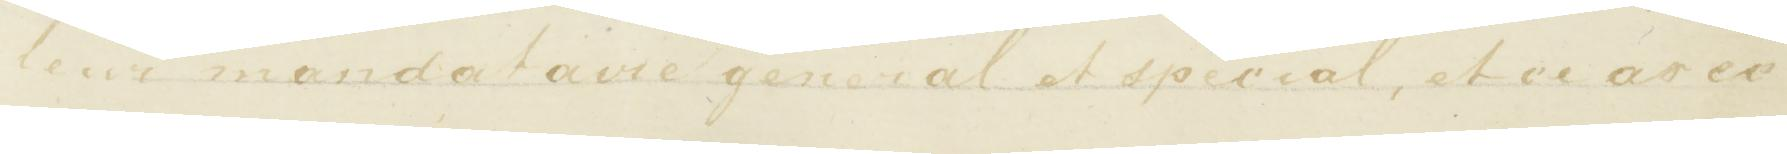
leur mandataire genaral et special, et ce avec
